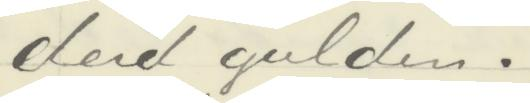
derd gulden.
